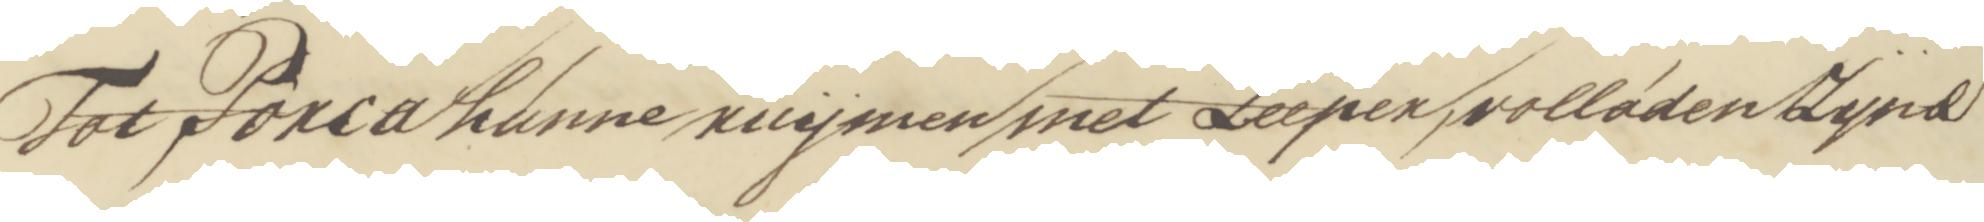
Tot Porca kunne ruijmen met Peeper, volláden zijnd
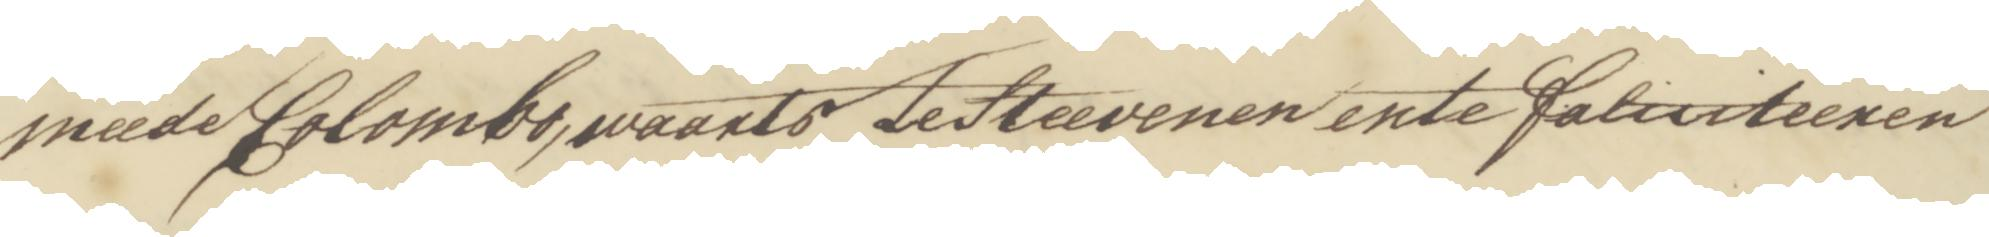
meede Colombo, waarts te steevenen en te faliciteeren
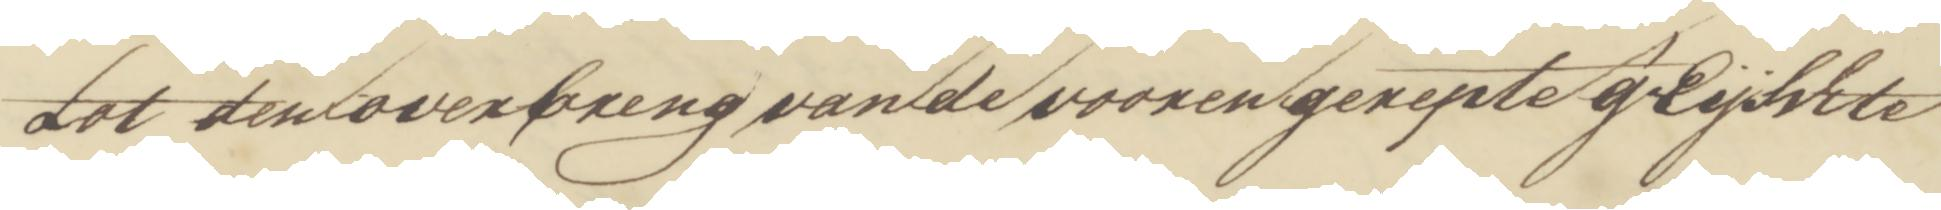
tot den overbreng van de vooren gerepte g’Eijschte
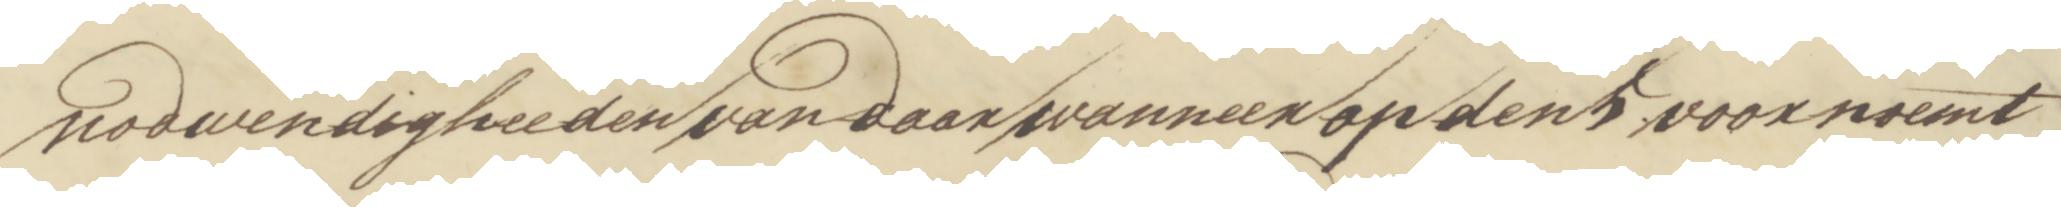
nodwendigheeden van daar wanneer op den 5 voornoemt
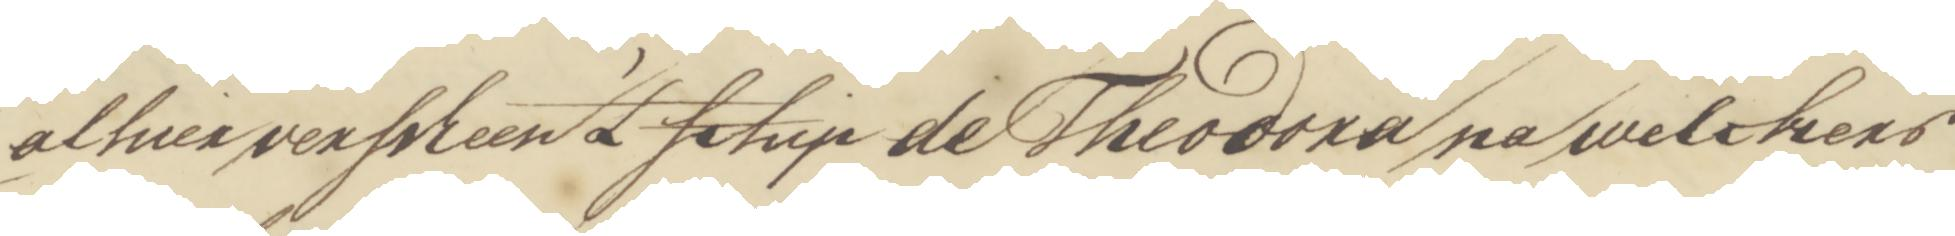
alhier verscheen 't schip de Theodora na welckers
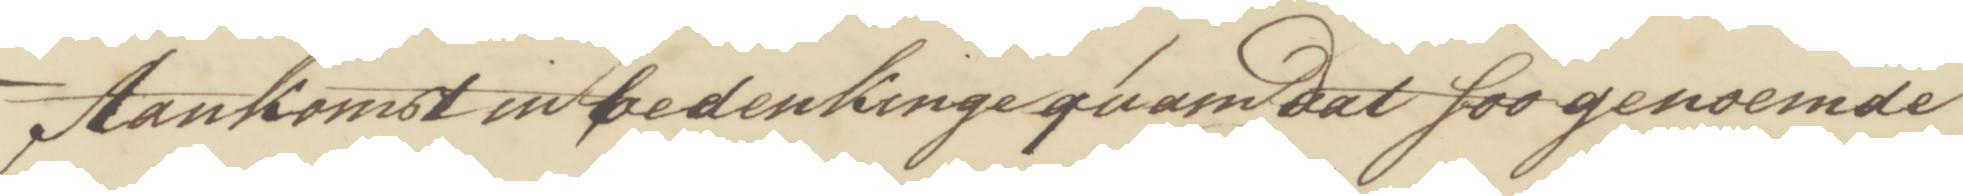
Aankomst en bedenkinge quam dat soo genoemde
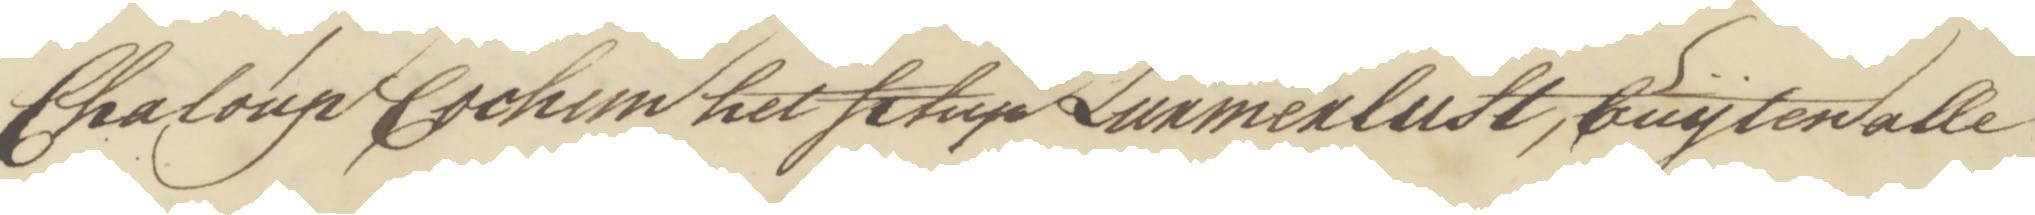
Chaloup Cochim het schip Purmerlust, buijten alle
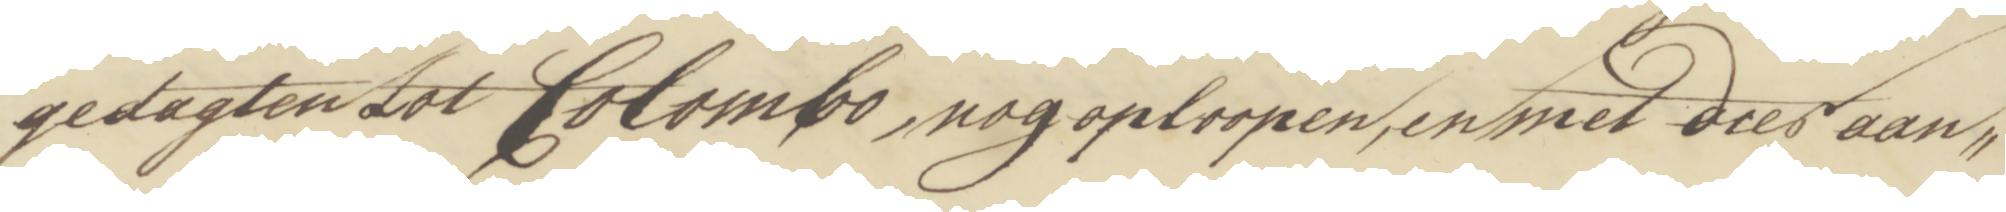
gedagten tot Colombo, nog oploopen, en met dies aan„
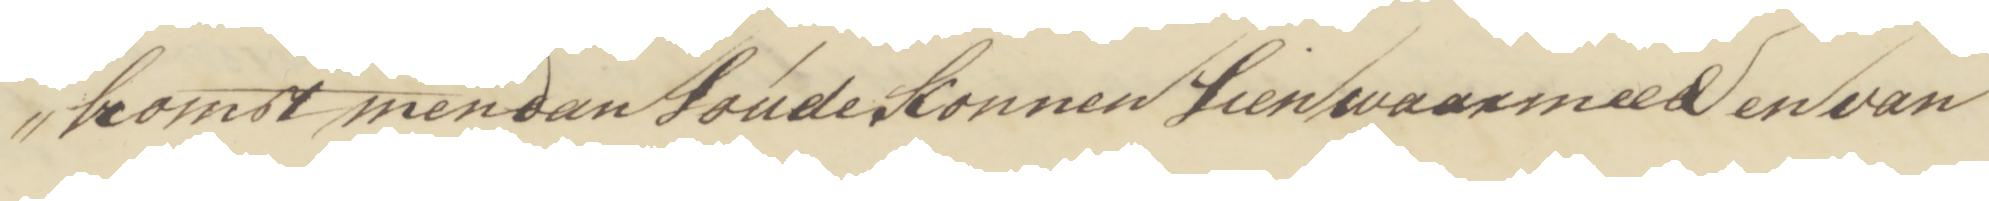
„komst men dan soude konnen sien waarmeed en van
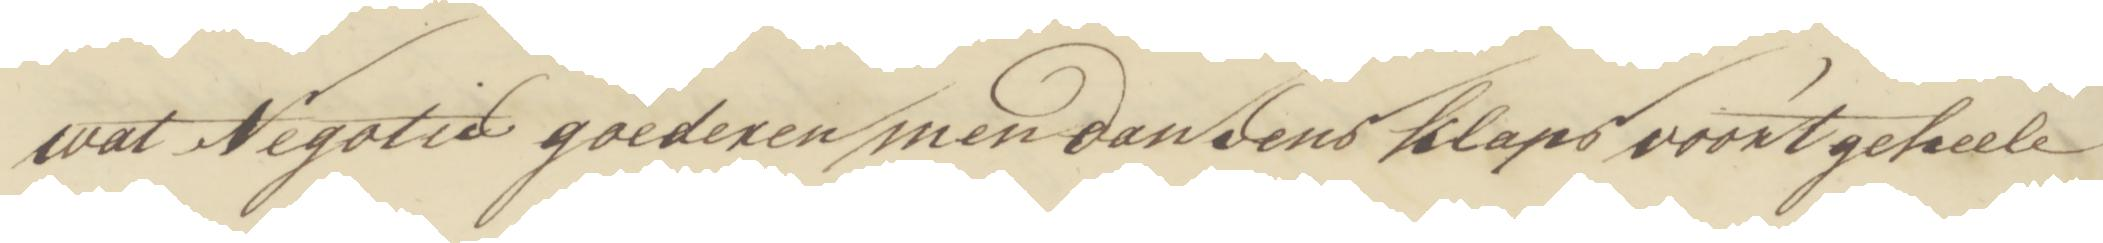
wat Negotie goederen men dan eens klaps voor't geheele
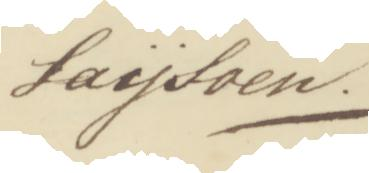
saijsoen.
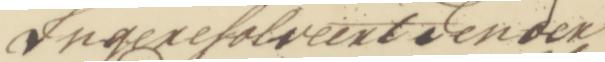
En geresolveert een der
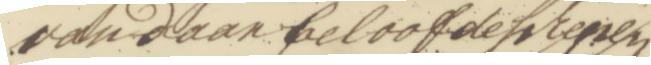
van daar beloofde schepen
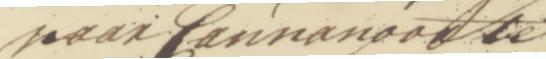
naar Cannanoor te
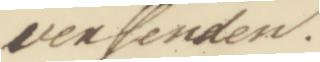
versenden.
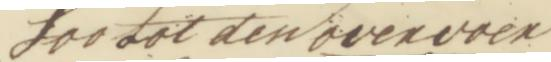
Soo tot den overvoer
